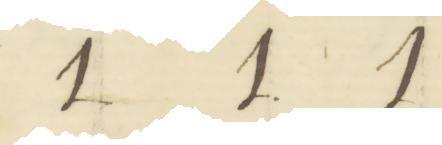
1 1 1
